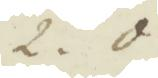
2. d
